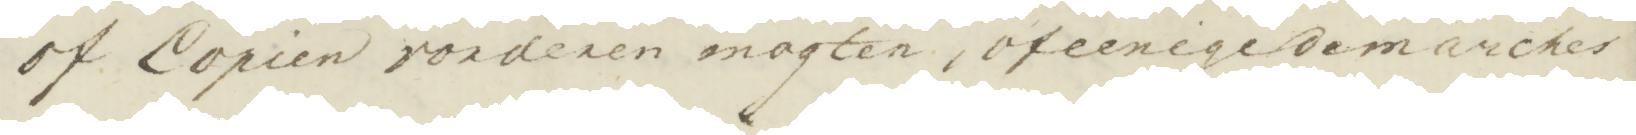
of Copien vorderen mogten, of eenige demarches
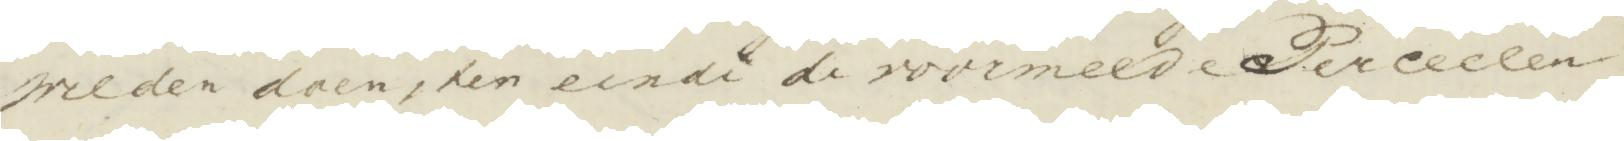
wilden doen, ten einde de voormelde Perceelen
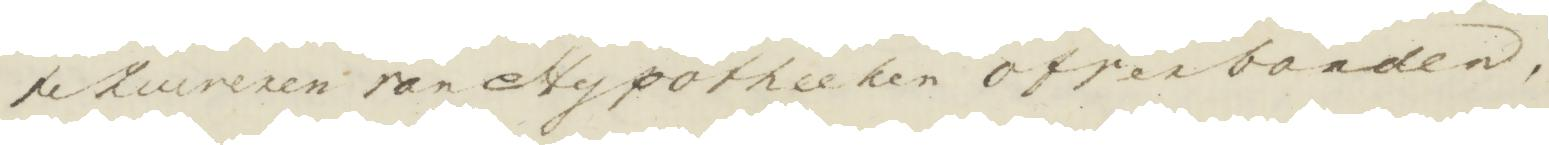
te zuiveren van Hypotheeken of verbonden,
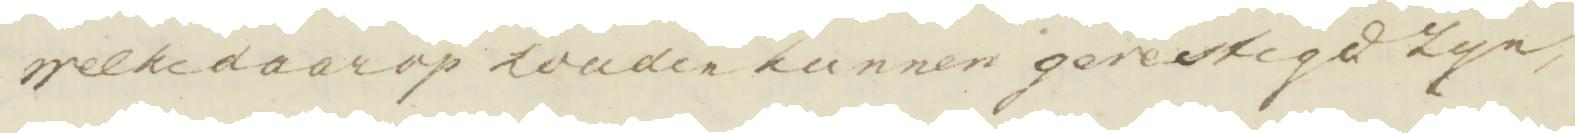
welke daarop zouden kunnen gevestigt zyn,
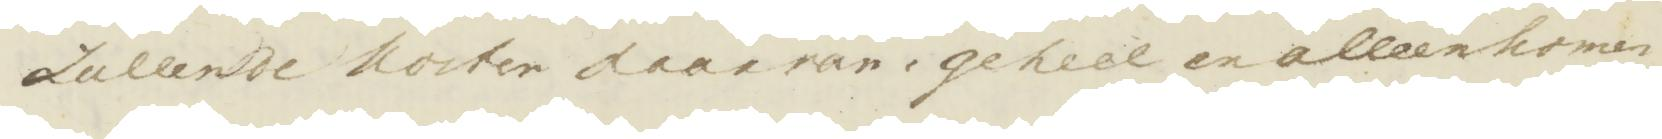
zullende kosten daar van, geheel en alleen komen
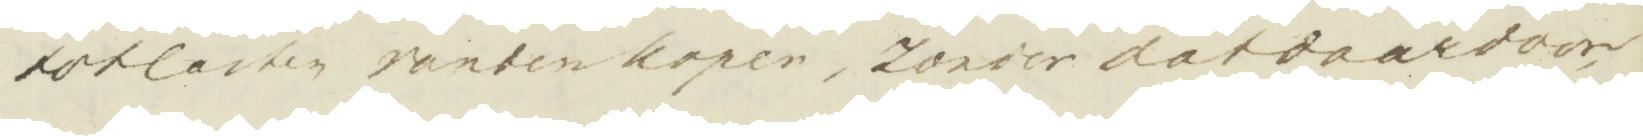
tot lasten van den koper, zonder dat daardoor
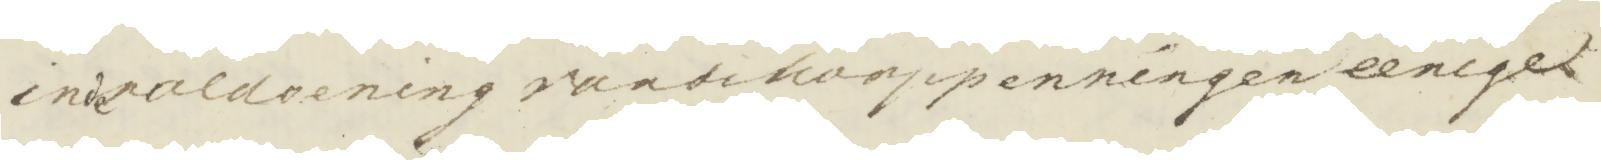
in de voldoening van de kooppenningen eenige
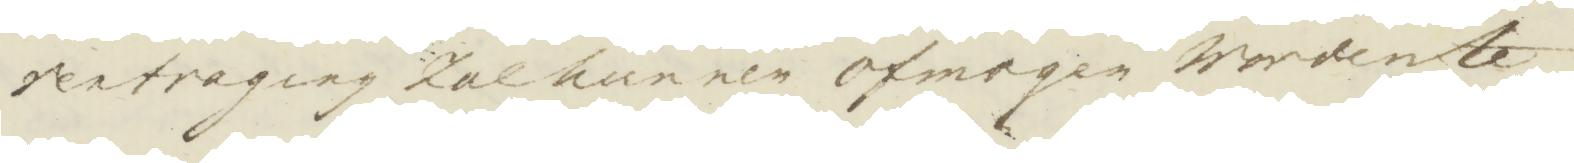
vertraging zal kunnen of mogen worden te
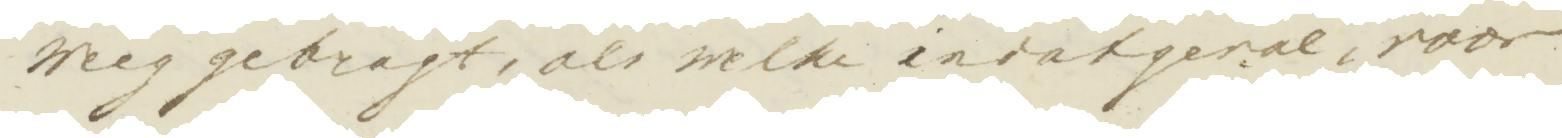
weeg gebragt, als welke in dat geval, voor
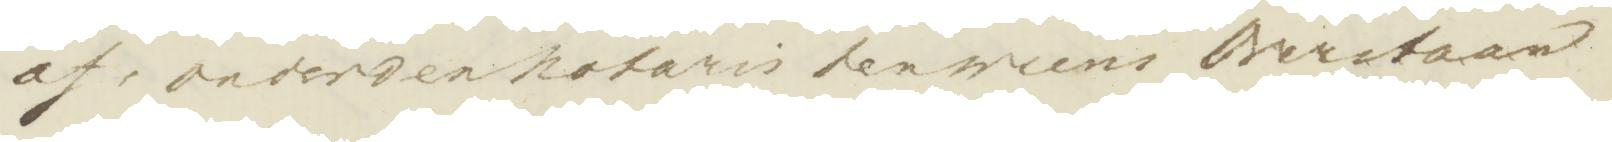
af, onder den notaris ten wiens Overstaan
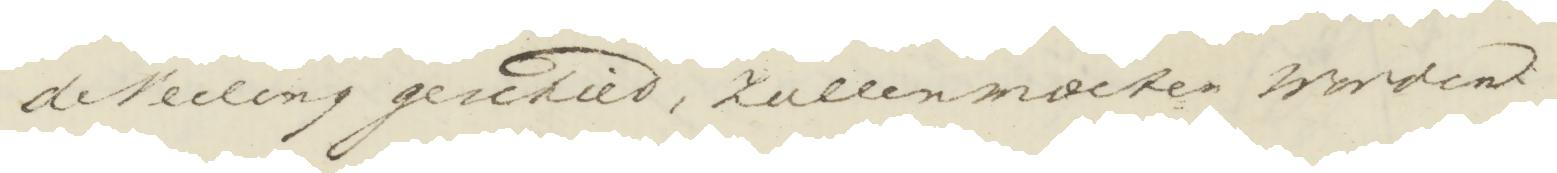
de veiling geschied, zullen moeten worden
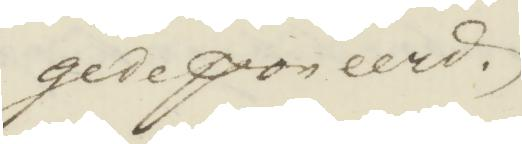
gedeponeerd.
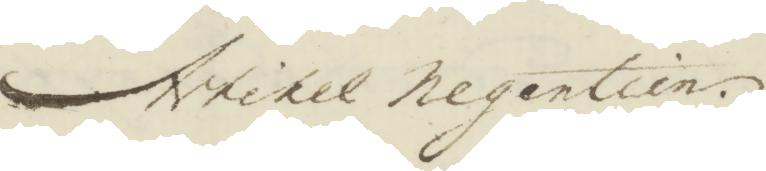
Artikel negentien.
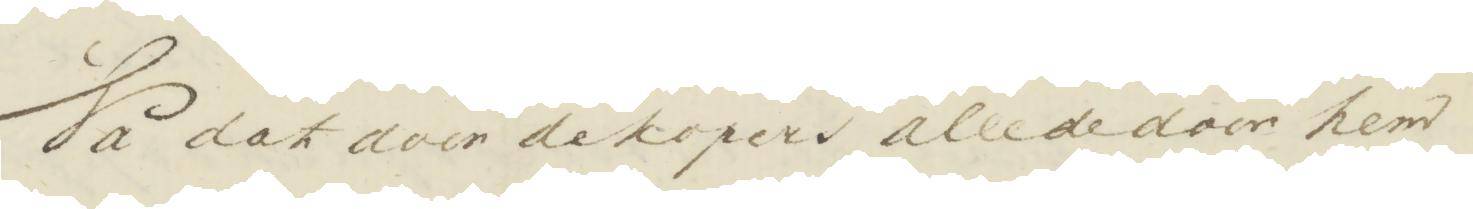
Na dat door de kopers alle de door hem
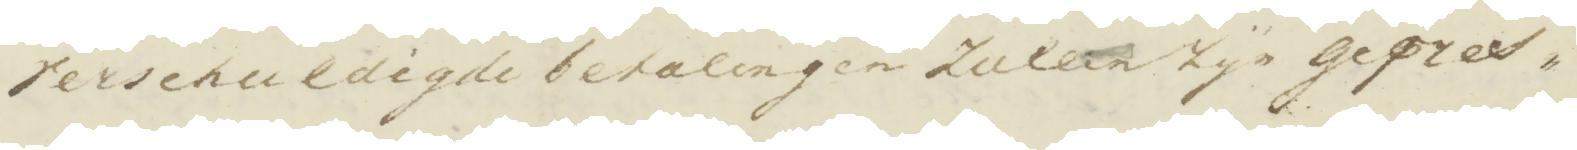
verschuldigde betalingen zullen zijn gepres„
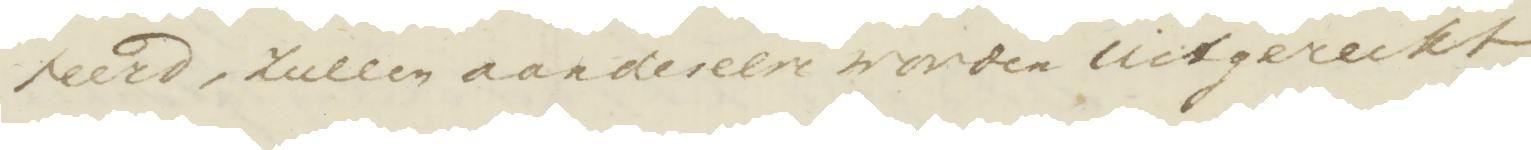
teerd, zullen aan deselve worden uitgereikt
